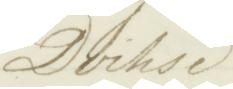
Dirkse
